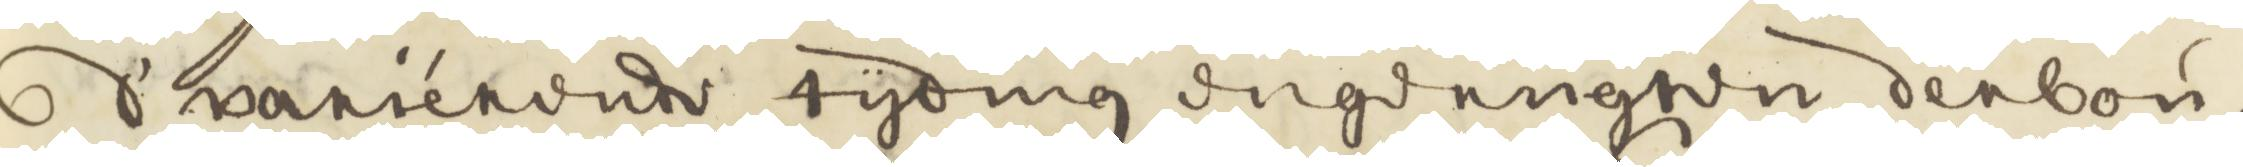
d’ variérende tijding en gerugten der bou„
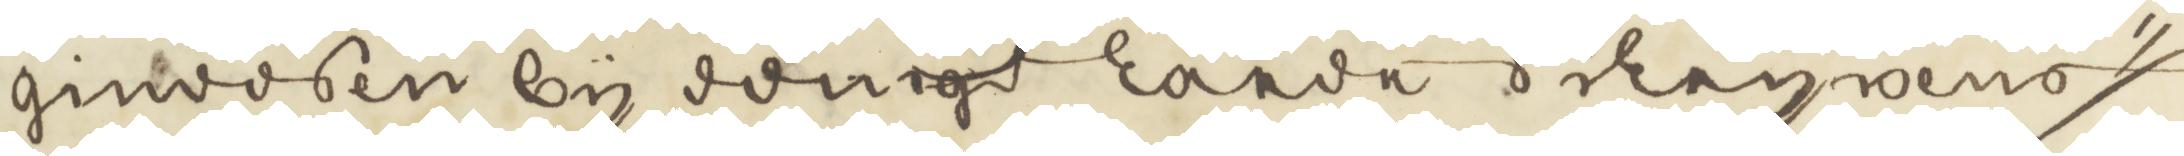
gineesen bij eenige harer schrijvens
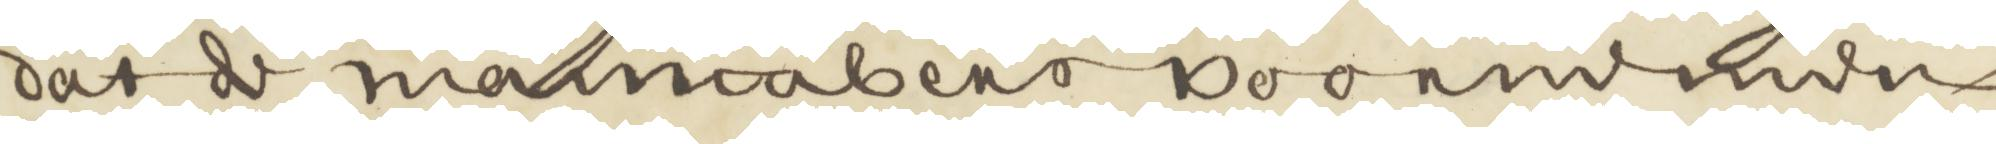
dat de manicabers voornemen
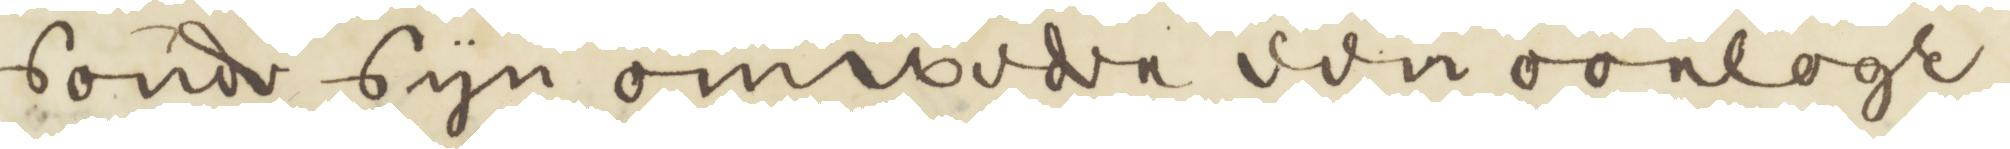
soude sijn om weder een oorlogh
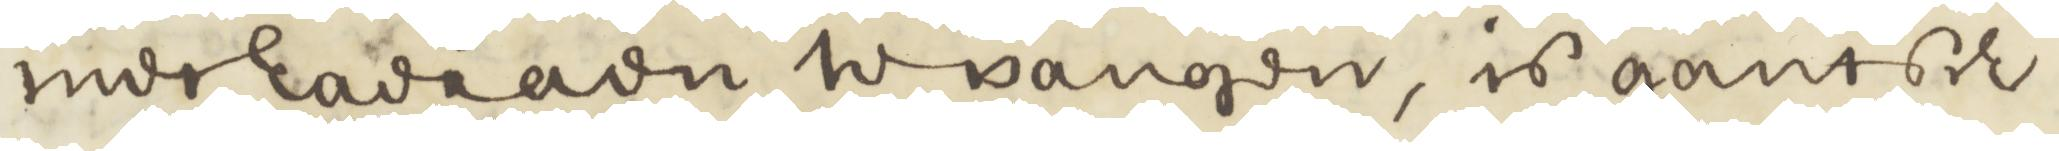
met haer aen te vangen, is gantsch
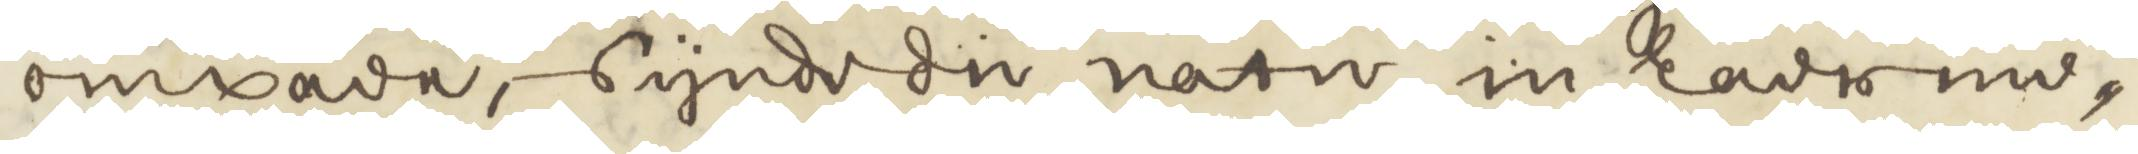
onwaer, sijnde die natie in haer me„
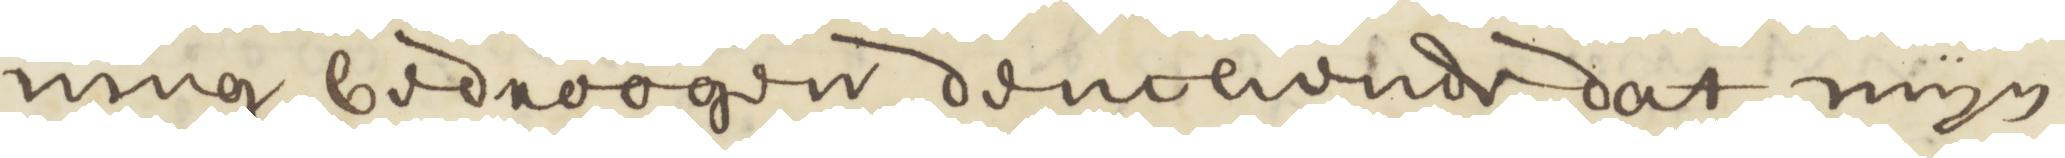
ning bedroogen denckende dat mijn
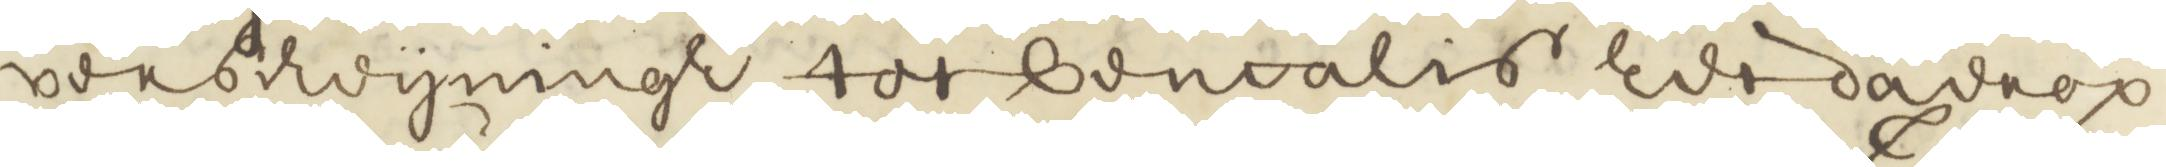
verscheijningh tot bencalis het daerop
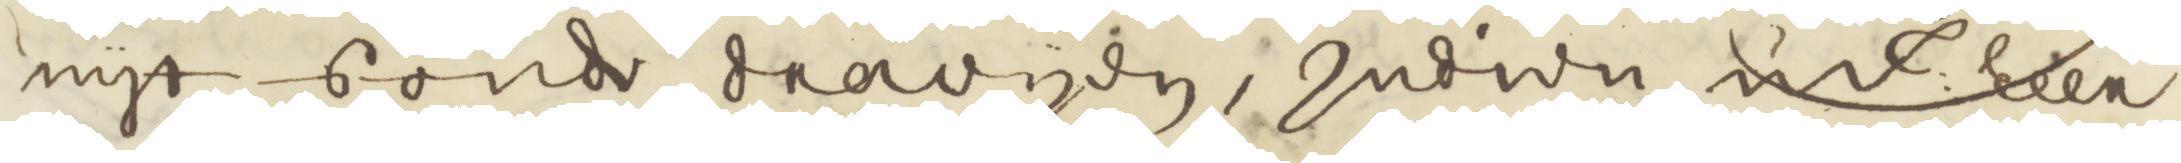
uijt soude draeijen, jndien uE: heer
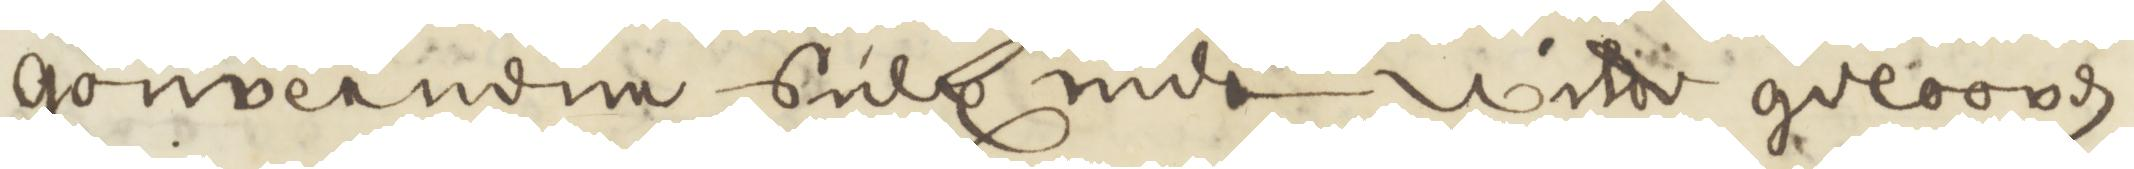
gouverneur sulx niet wilde gelooven
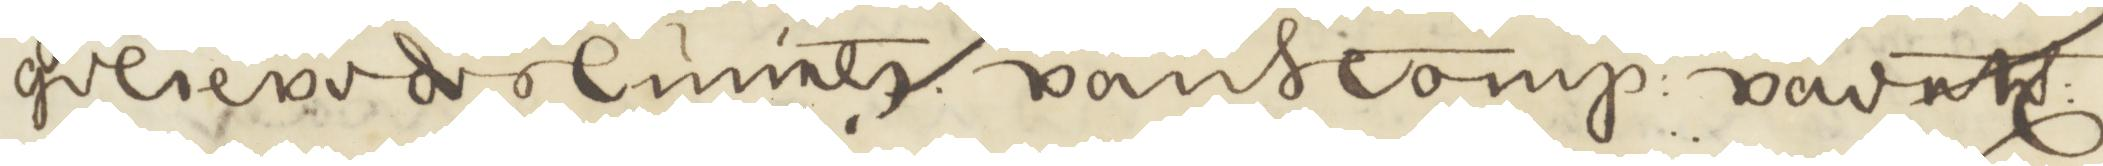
gelieve de stuurlijk van ’s Comp:s vaertver:
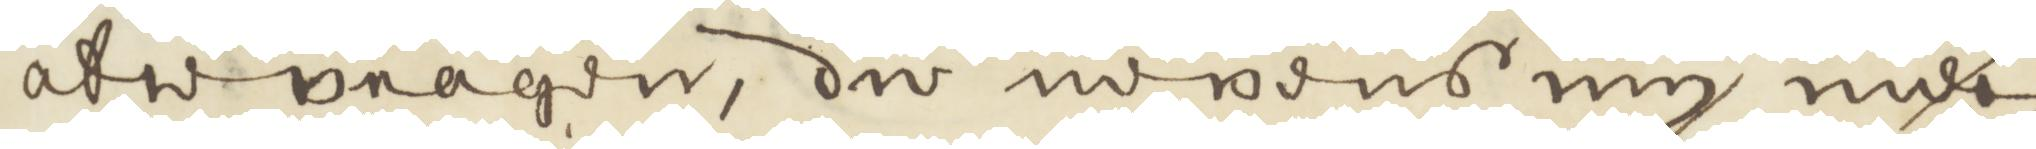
afte vragen, die nevens mij niet
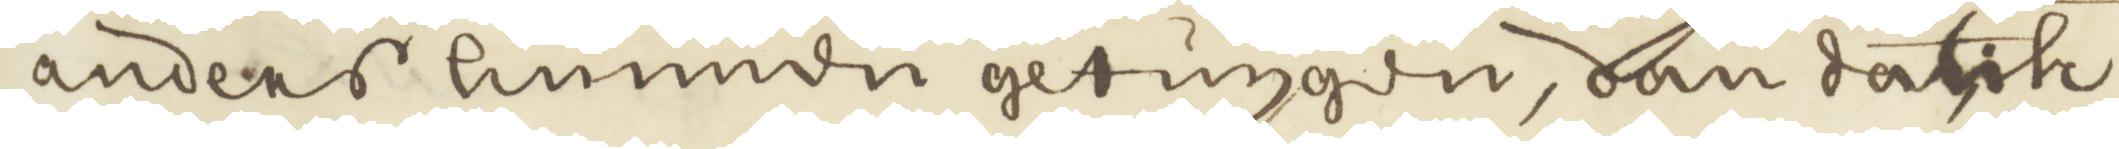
anders kunnen getuijgen, dan dat, ik
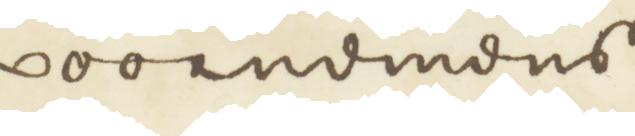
voornemens
